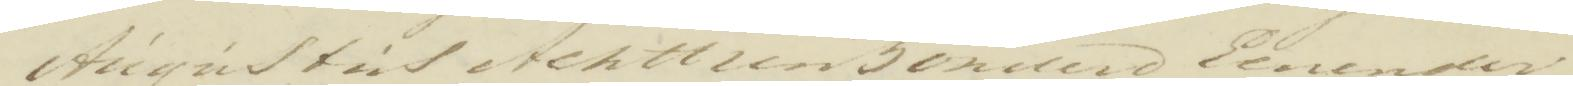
Augustus Achttien honderd Eenender,
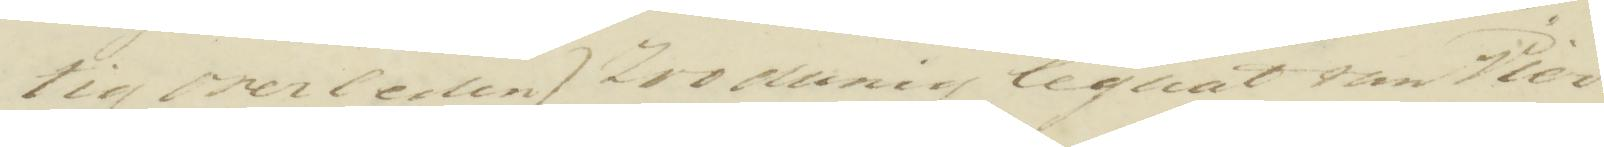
tig overleden) zoodaanig legaat van Vier
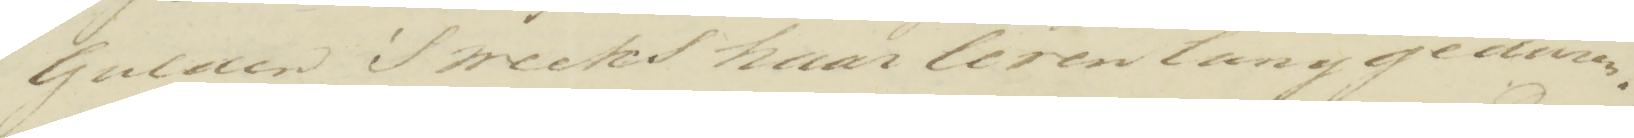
Gulden 's weeks haar leven lang geduren,
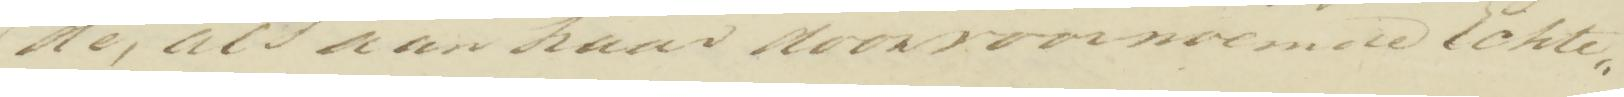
de, als aan haar door voornoemde Echte„
